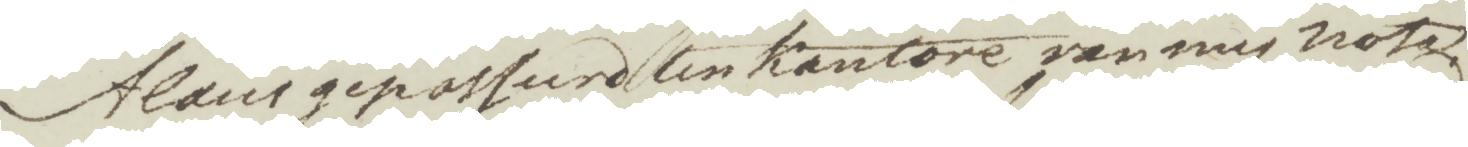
Aldus gepasseerd ten kantore van my nota
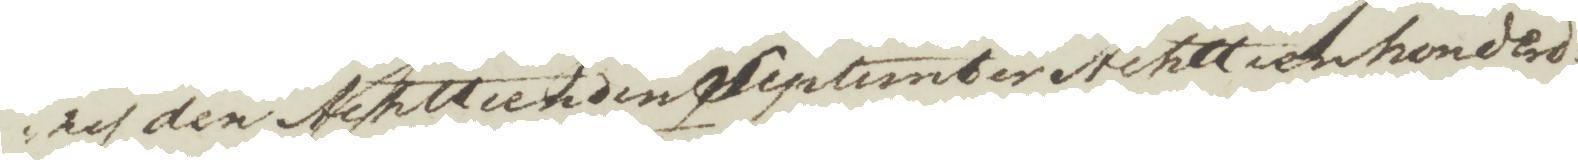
„ris den Achttienden September Achttien honderd.
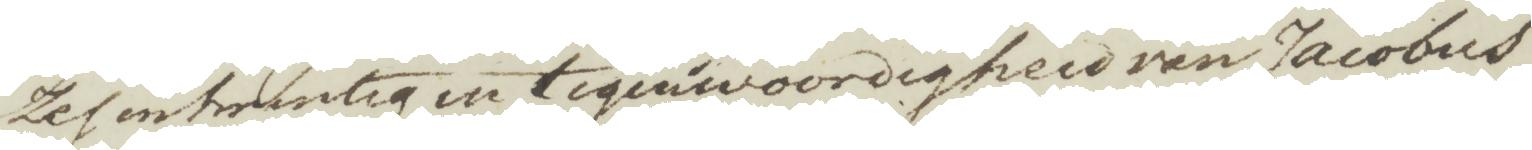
zes en twintig in tegenwoordigheid van Jacobus
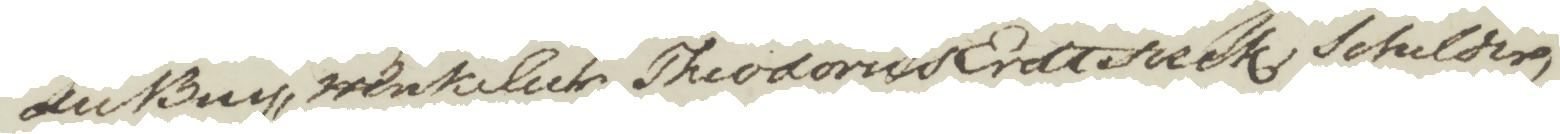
du Buy, winkelier Theodorus Erdtsieck, schilder
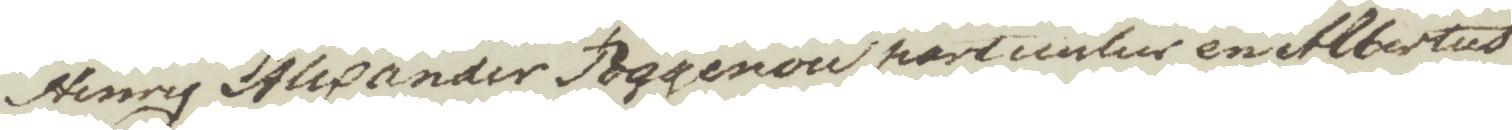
Henry Alexander Poggenou particulier en Albertus
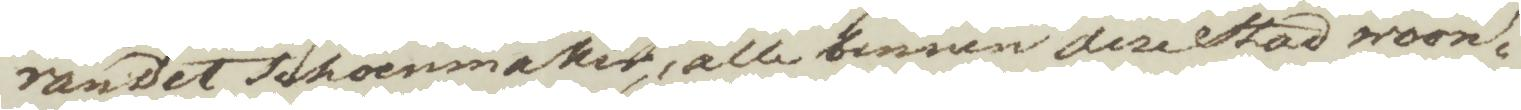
van Det Schoenmaker, alle binnen deze stad woon„
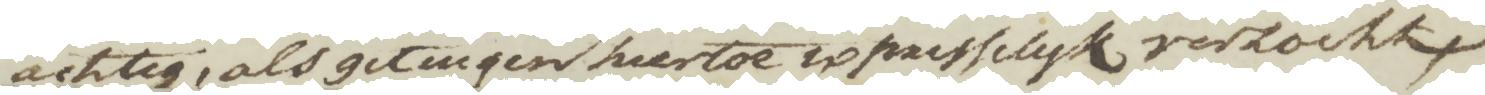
achtig, als getuigen hiertoe expresselyk verzocht,
